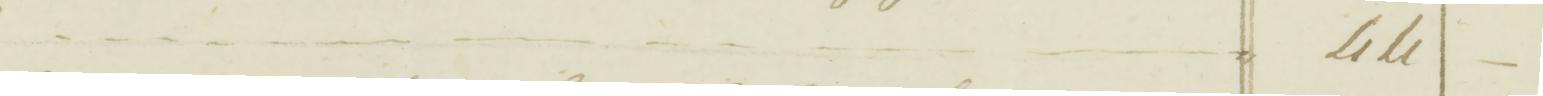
44 —
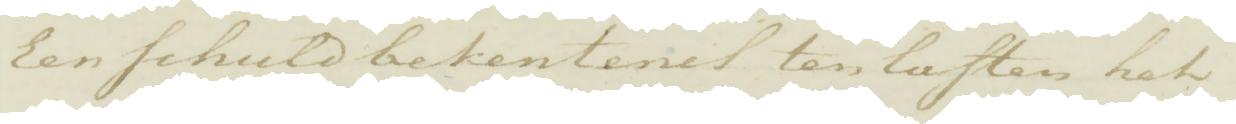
Een schuld bekentenis ten lasten het
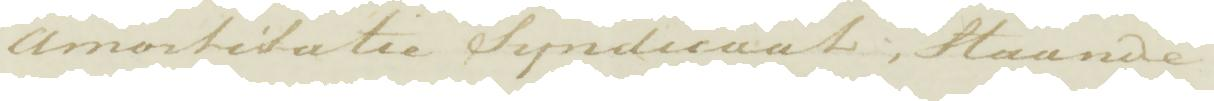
Amortisatie Syndicaat, staande
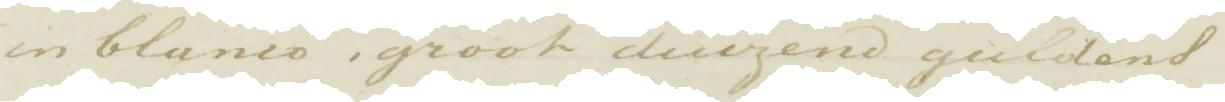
in blanco, groot duizend guldens
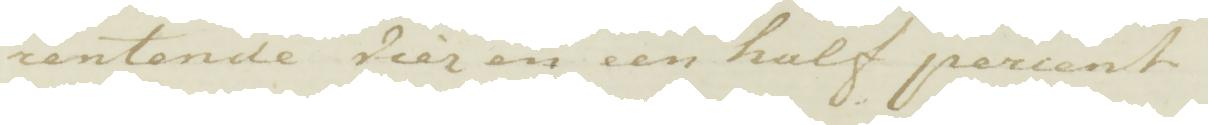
rentende vier en een half percent
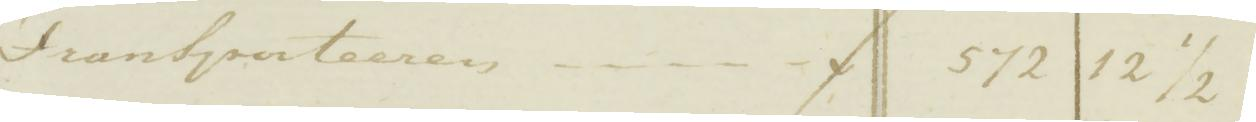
Transporteeren ƒ 572 12½
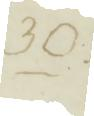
30:
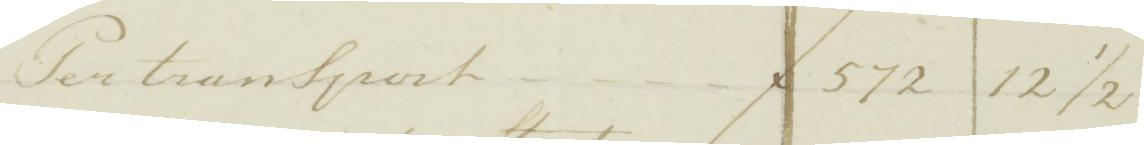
Per transport _ _ _ _ ƒ 572 12½
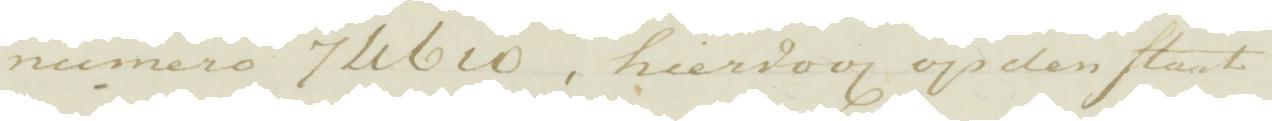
numero 74610, hiervoor op den staat
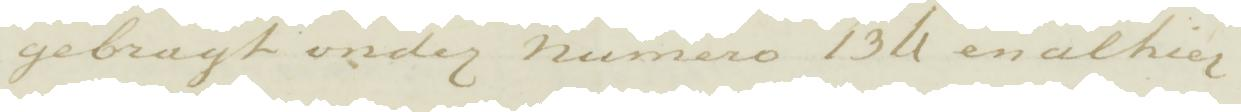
gebragt onder numero 134 en alhier
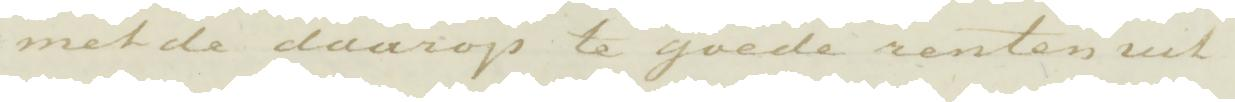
met de daarop te goede renten uit
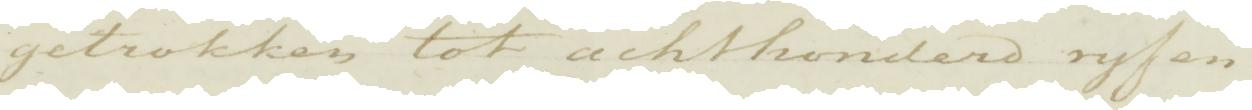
getrokken tot achthonderd vyf en
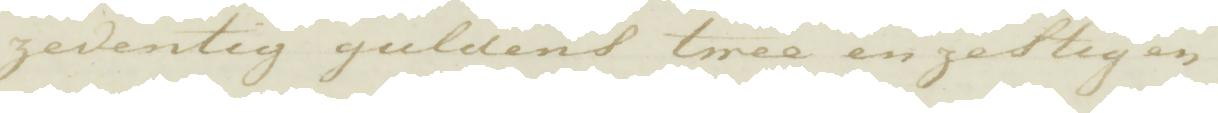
zeventig guldens twee en zestig en
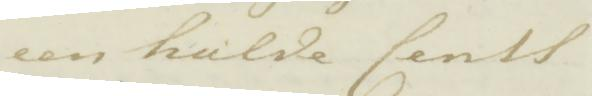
een halve Cents
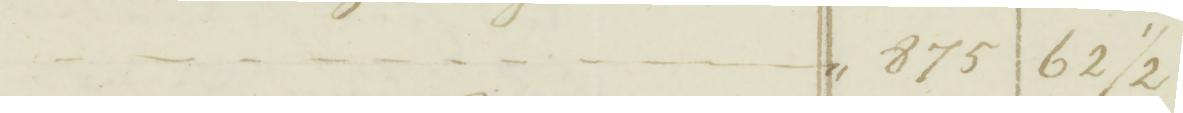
„ 875 62½
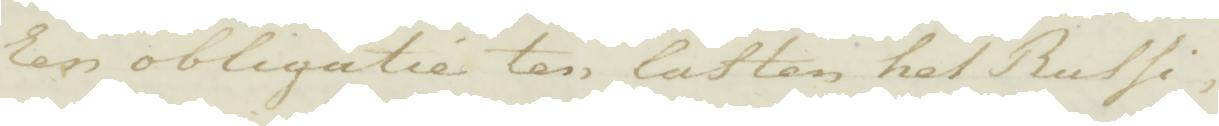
Een obligatie ten lasten het Russi,
